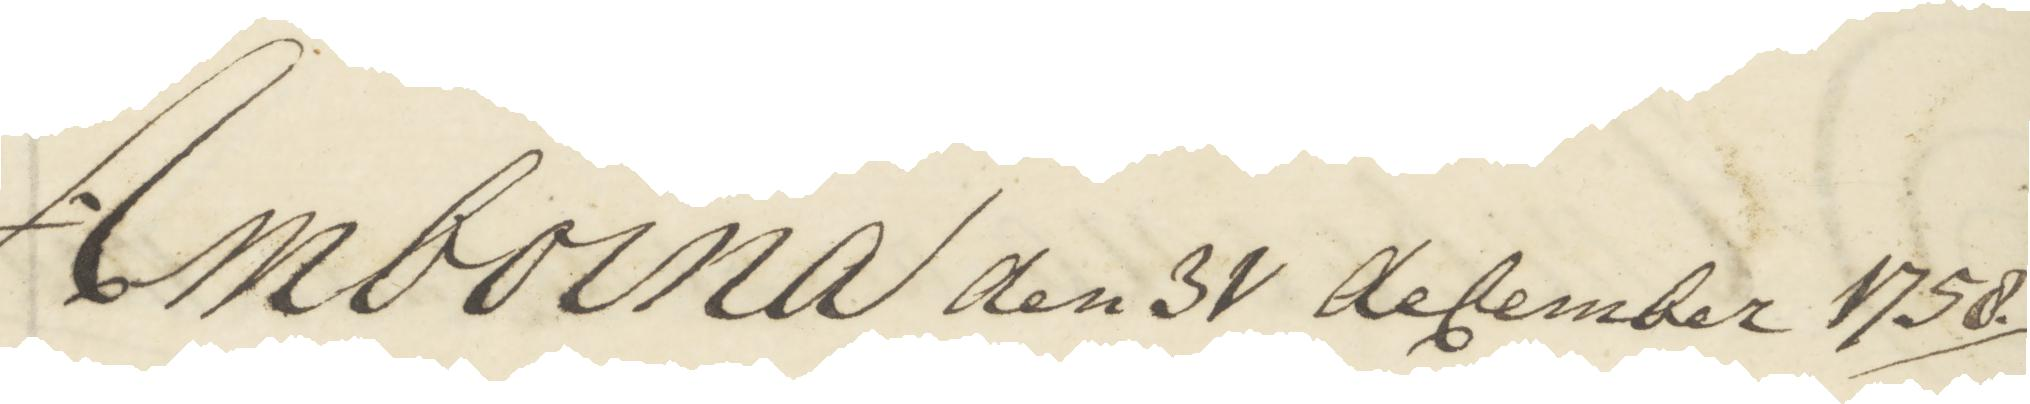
Amboina den 31 December 1758.
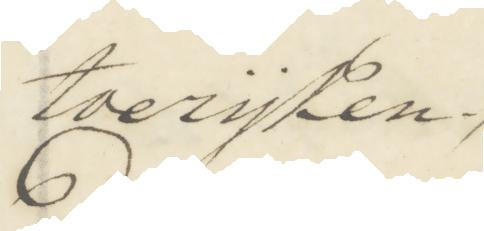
toerijken.
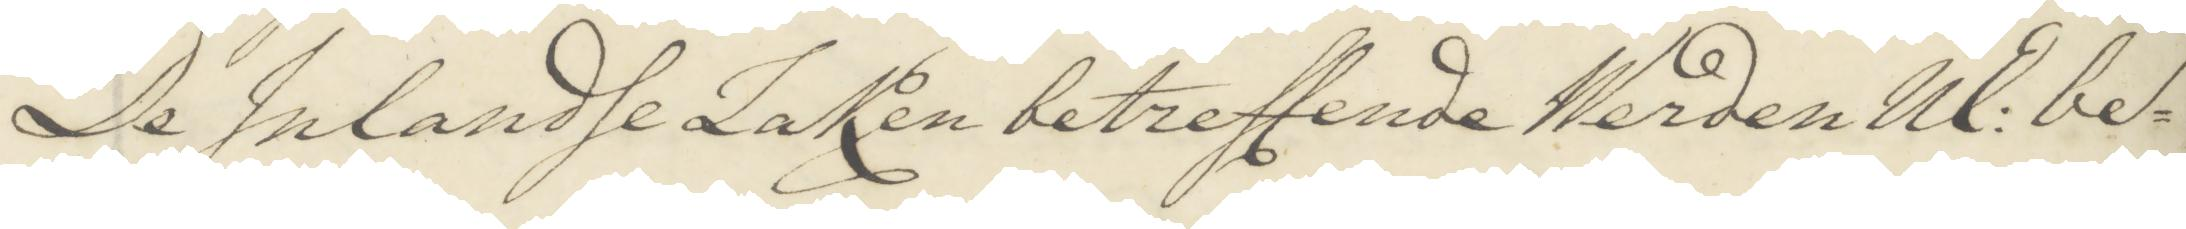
De jnlandse zaken betreffende Werden UE: be„
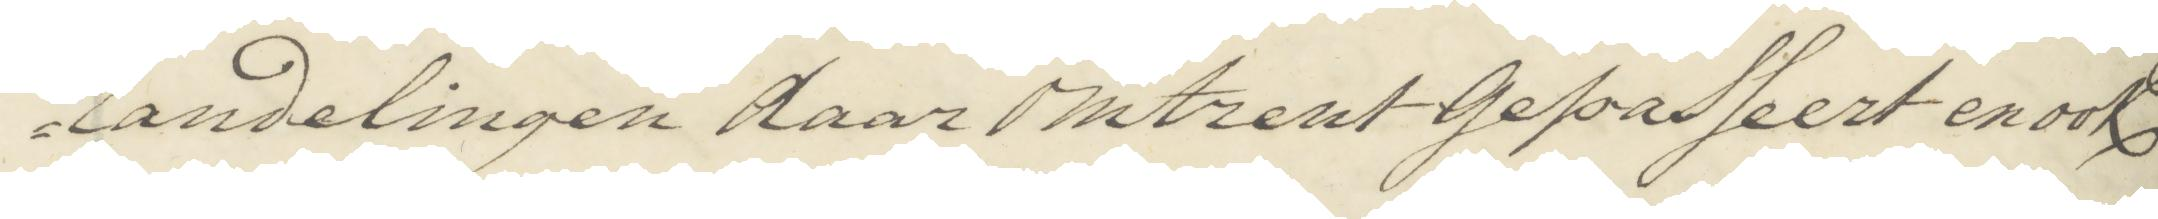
„handelingen daar omtrent gepasseert en ook
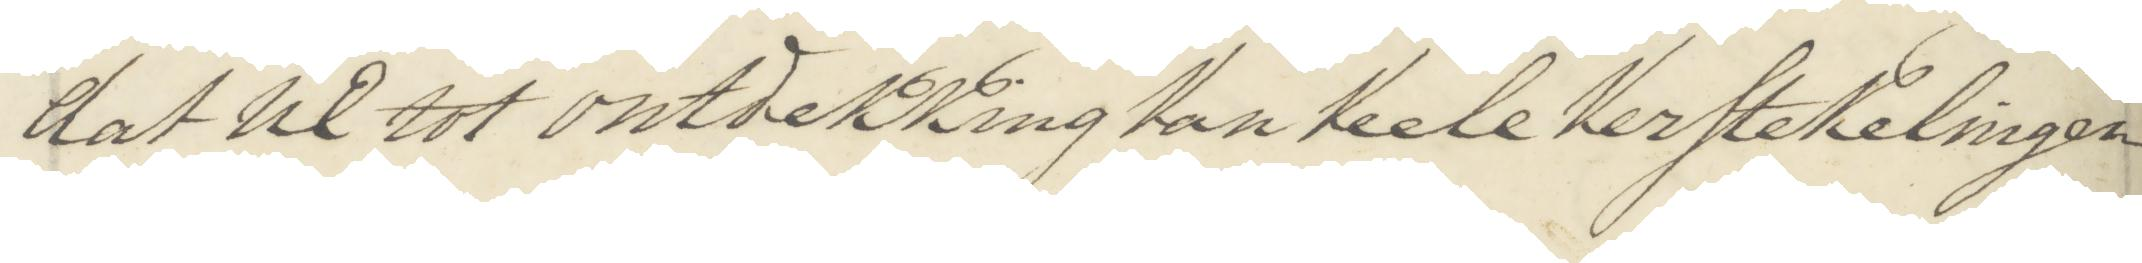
dat UE tot ontdekking van veele verstekelingen
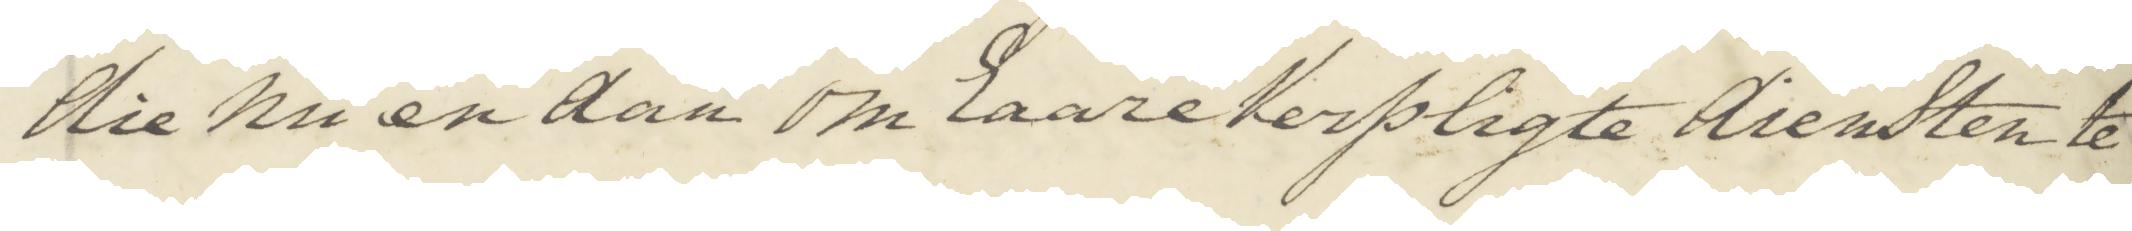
die nu en dan om haare verpligte diensten te
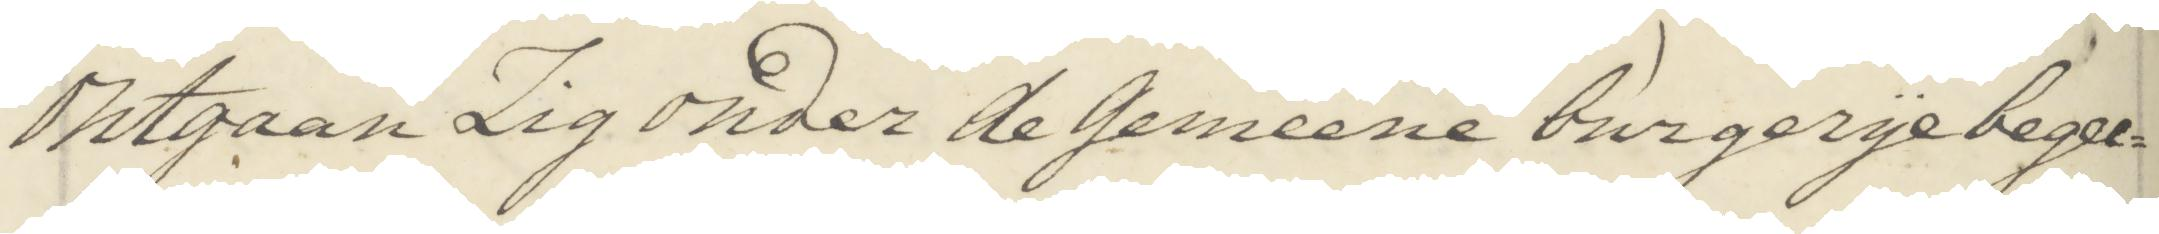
ontgaan zig onder de gemeene burgerije begee„
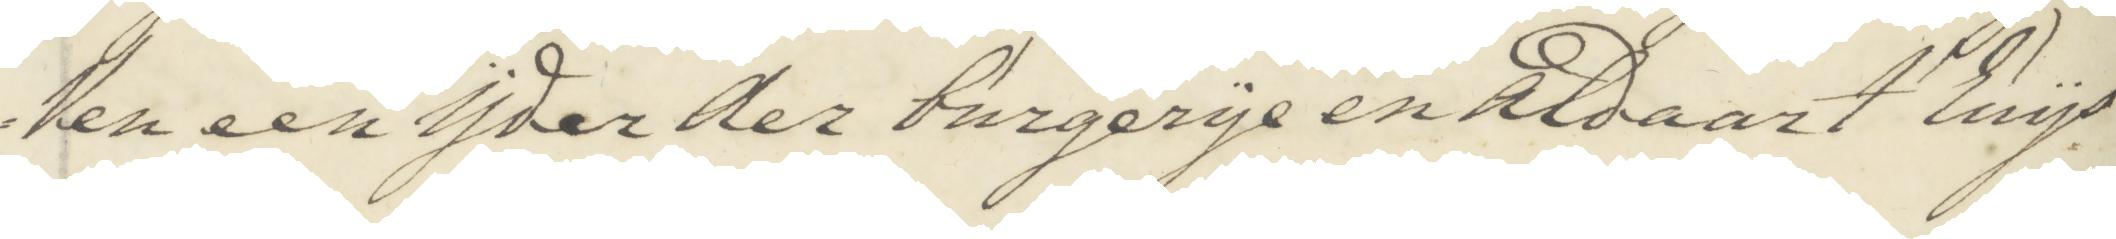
„ven een ijder der burgerije en aldaar t' huijs
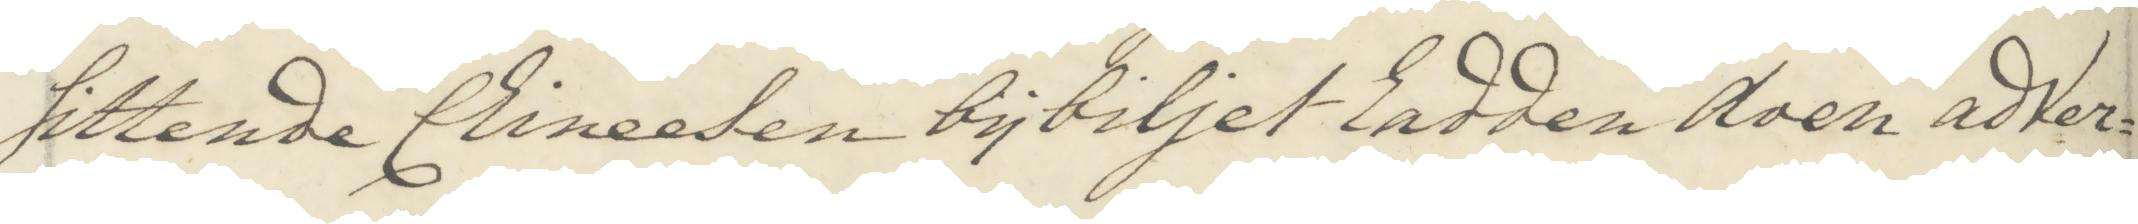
sittende Chineesen bij biljet hadden doen adver„
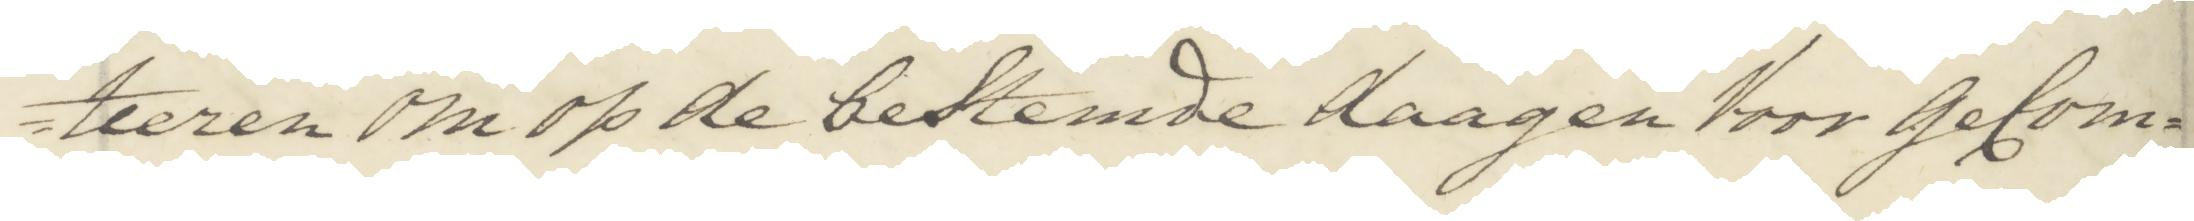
„teeren om op de bestemde daagen voor geCom„
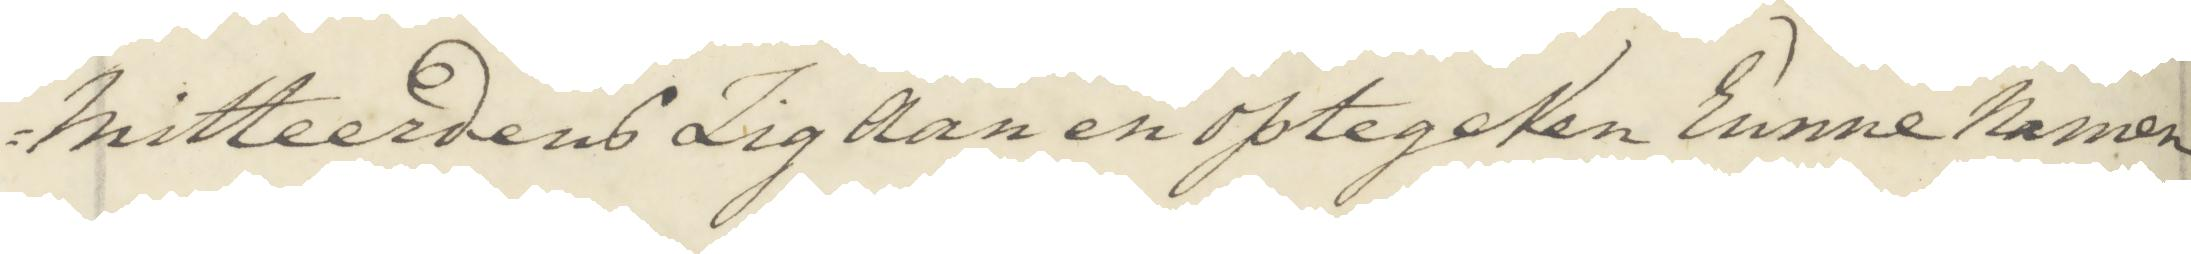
„mitteerdens zig Aan en optegeven hunne namen
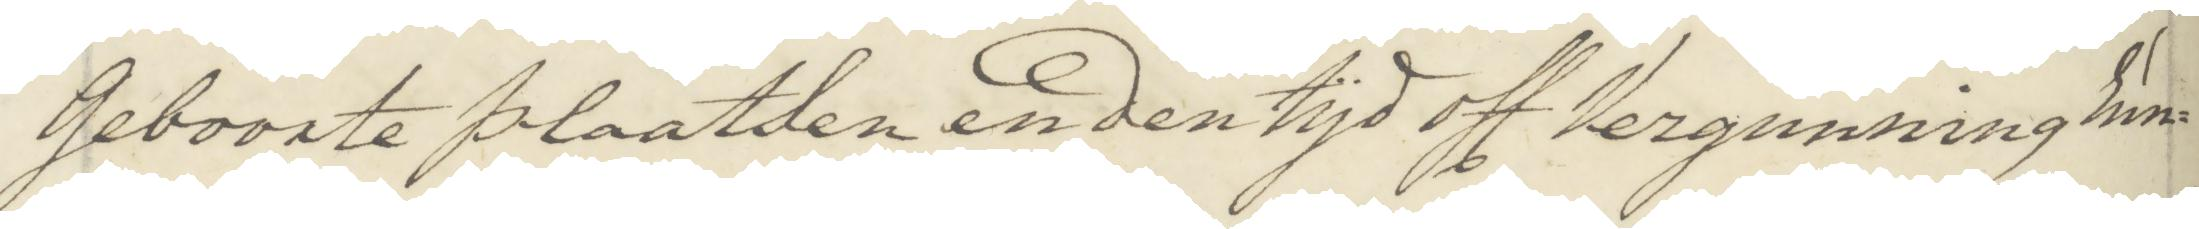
geboorte plaatsen en den tijd off vergunning hun„
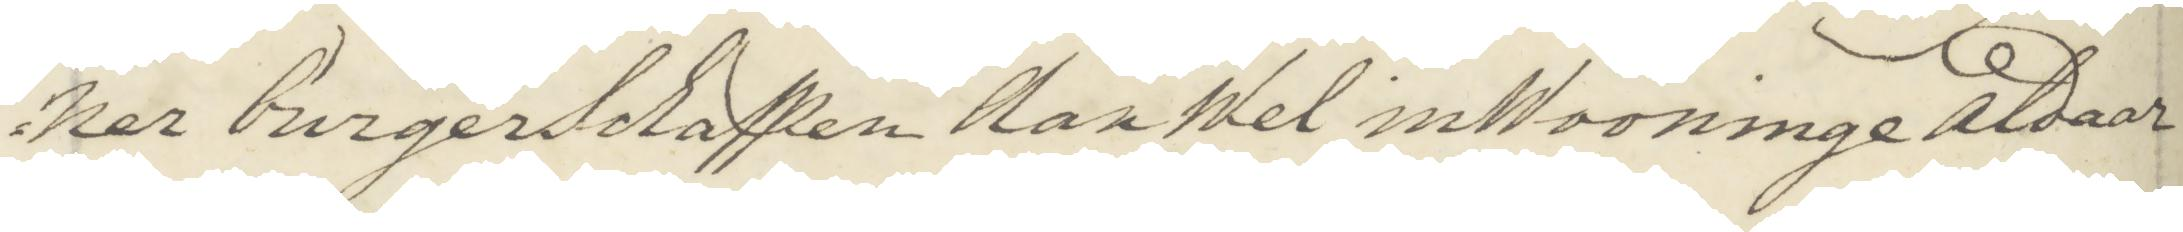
„ner burgerschappen dan wel inwooninge aldaar
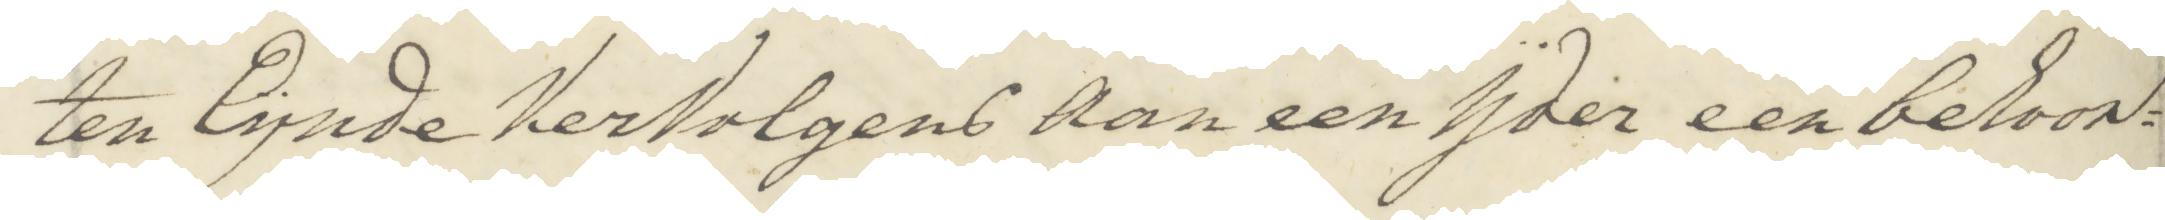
ten Eijnde vervolgens aan een ijder een behoor„
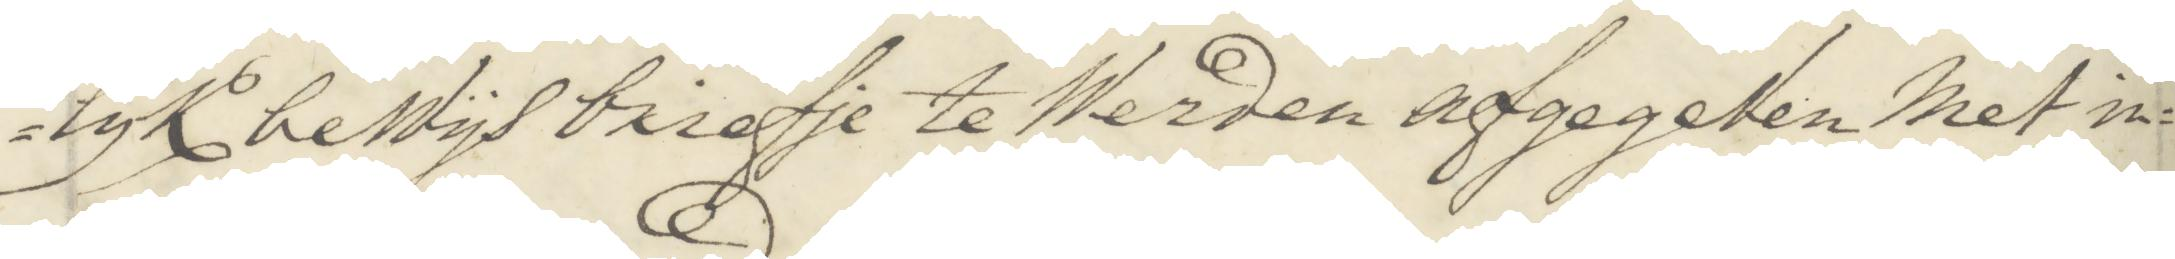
„lijk bewijs briefje te werden afgegeven met in„
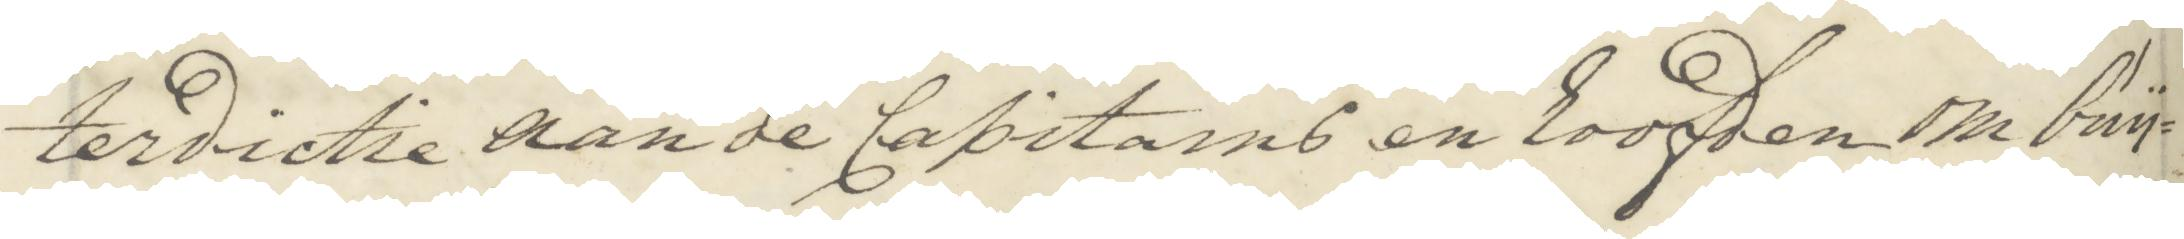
terdictie aan de Capitains en hoofden om buij„
